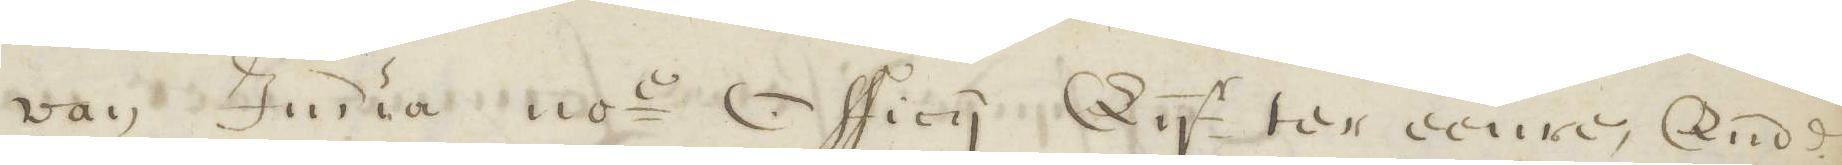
van India no=e Officij Eij=r ter eenre, Ende
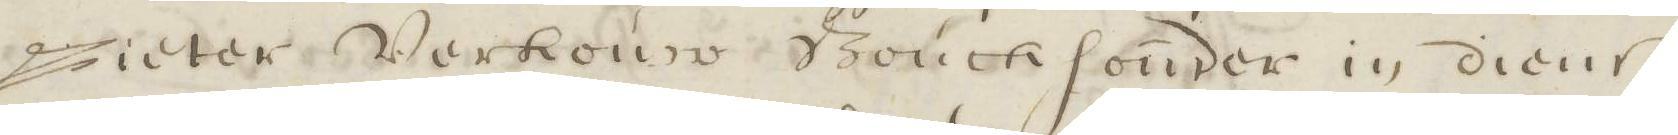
Pieter Verkouw Bouckhouder in dienst
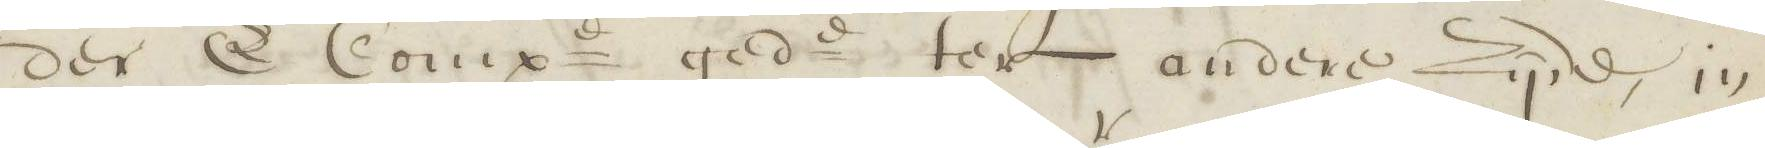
der E Comp=e ged=e ter andere zijde, in
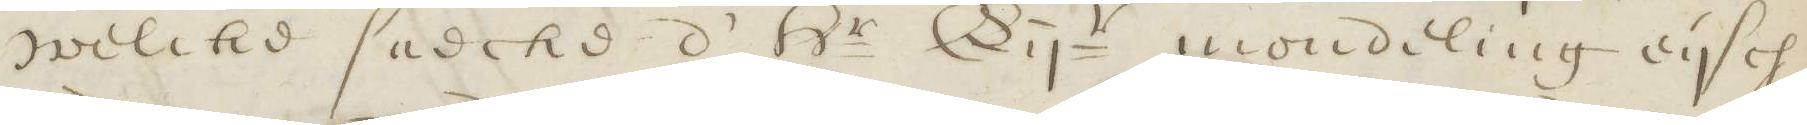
welcke saecke d’ H=r Eij=r mondeling eijsch
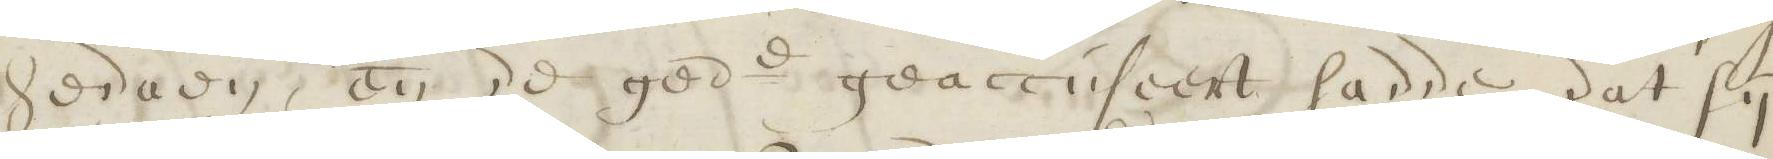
gedaen, en de ged=e geaccuseert hadde dat hij
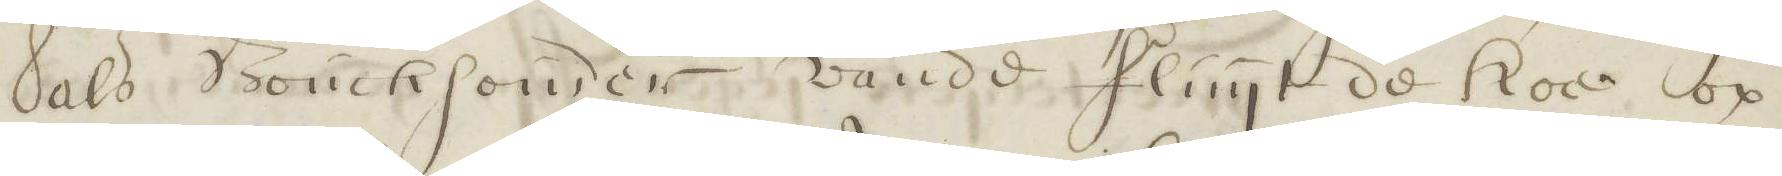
als Bouckhouder vande fluijt de Hoe op
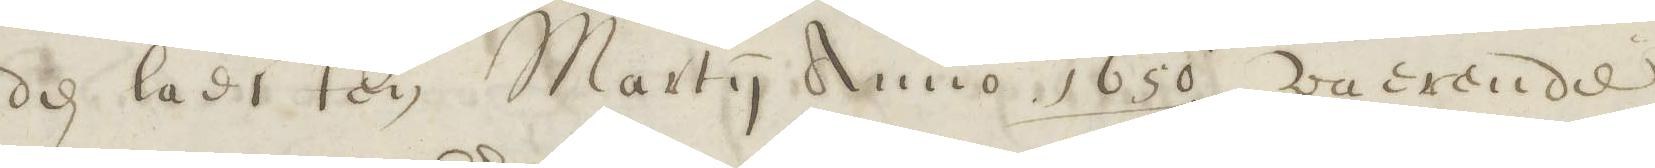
den laesten Martij Anno 1650 vaerende,
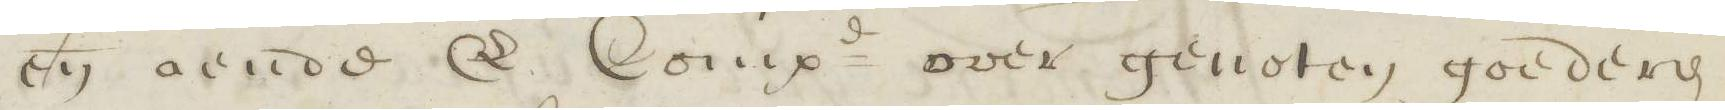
en aende E. Comp=e over genoten goederen
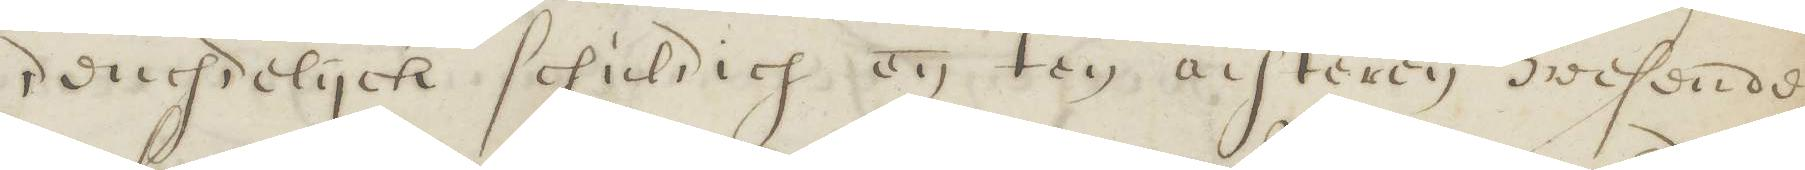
deuchdelijck schuldich en ten achteren wesende
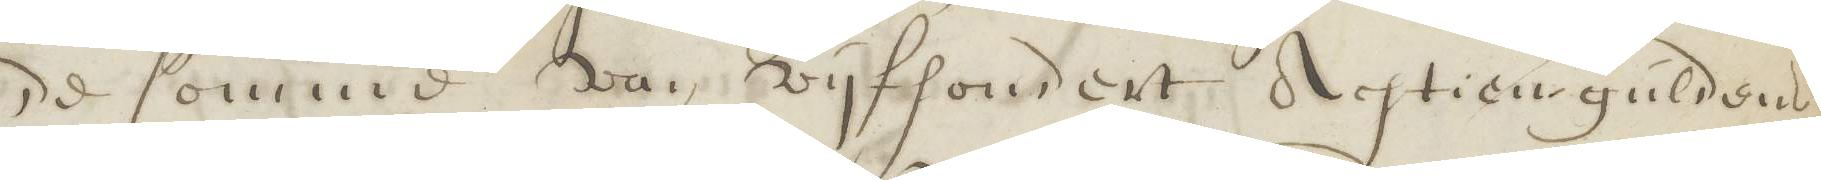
de somme van vijfhondert Achtien guldens
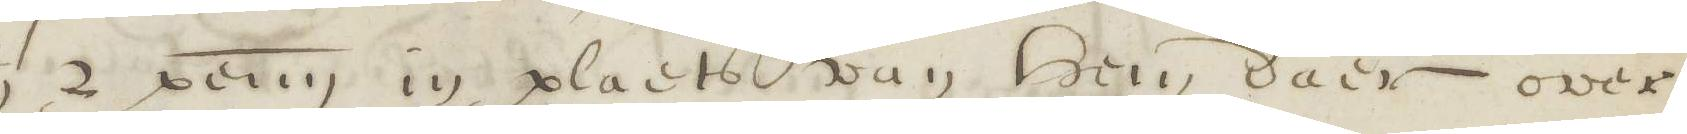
2 penn in plaets van hem daer over
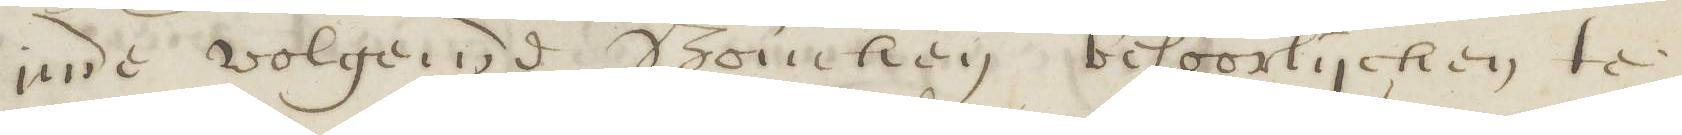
inde volgende Boucken behoorlijcken te
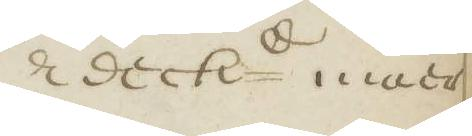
reeck=e maer
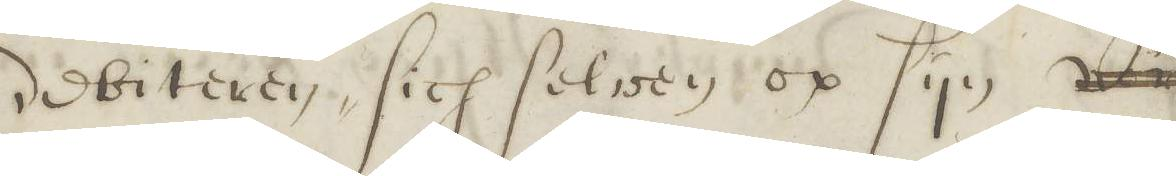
debiteren„ sich selven op sijn vordere
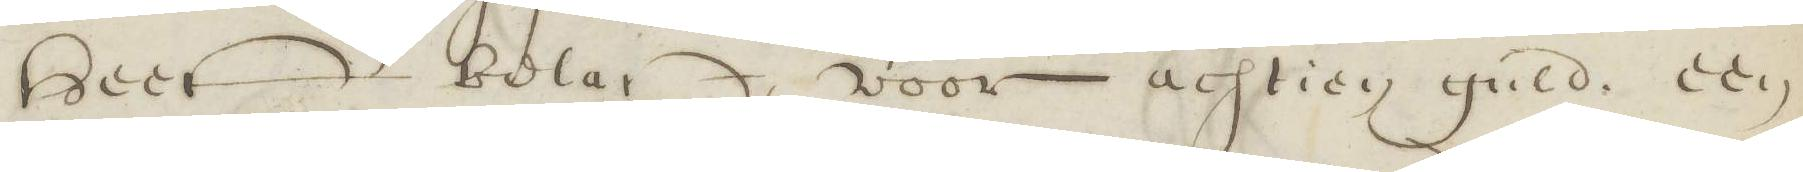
heeft belast, voor achtien guld. een
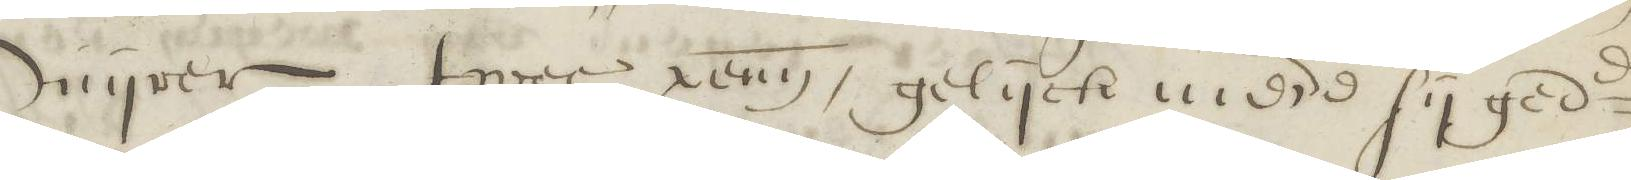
stuijver twee penn, gelijck mede hij ged=e
